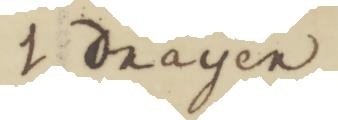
1 drayer
